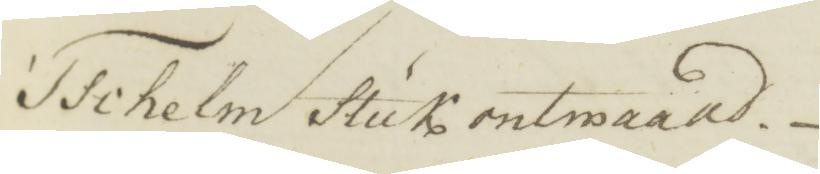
'T schelm stuk ontwaard.-
